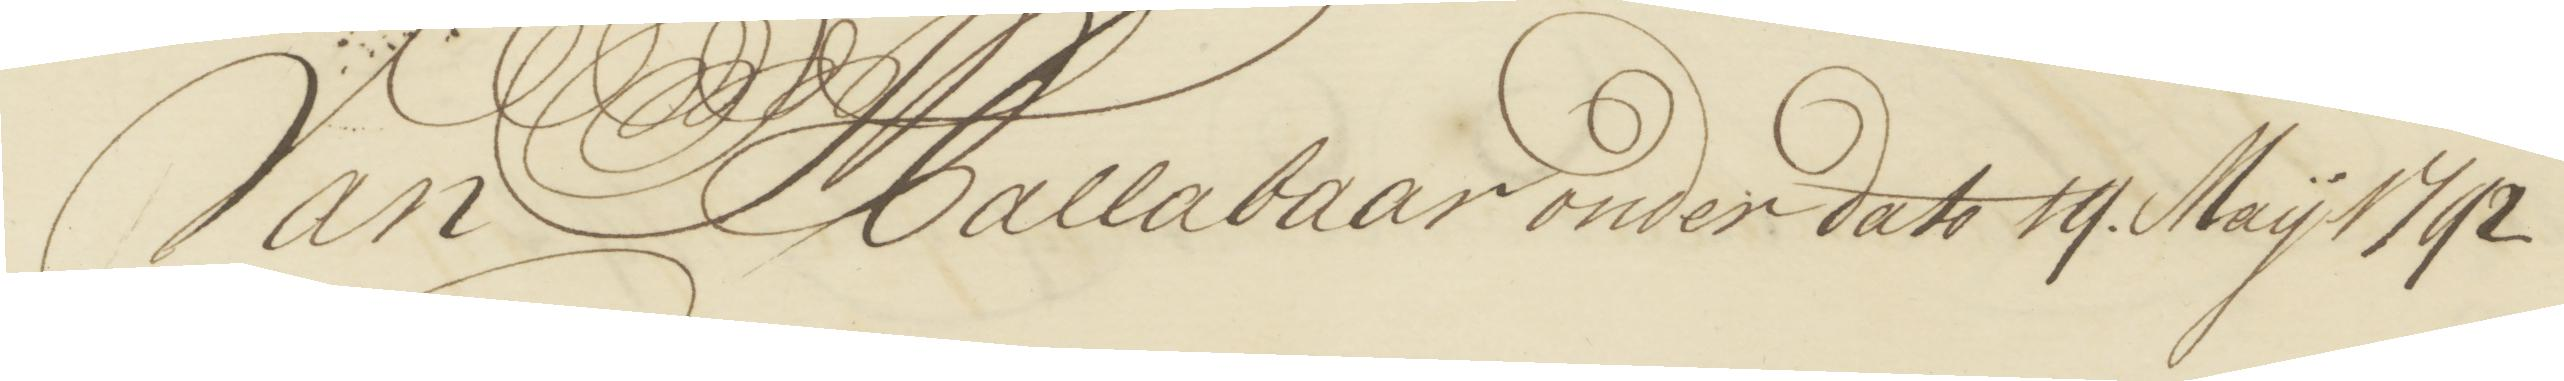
Van Mallabaar onder dato 14. Maij 1742
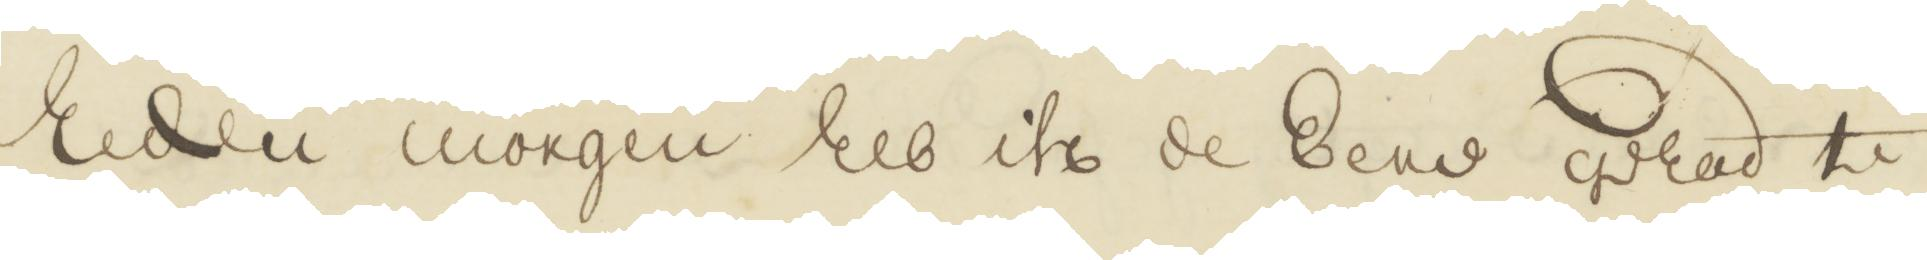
heden morgen heb ik de Eere gehad te
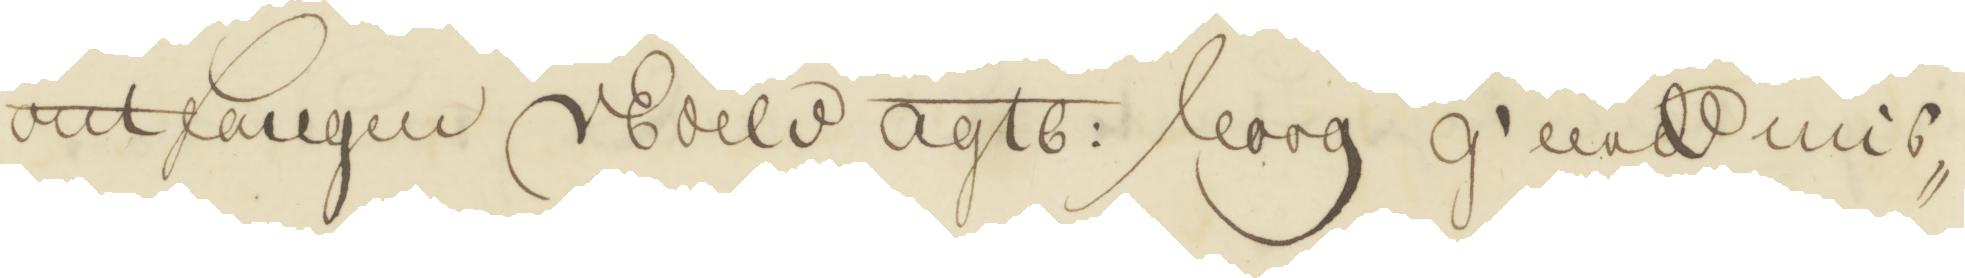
ontfangen vEdele agtb: hoog g’eerde mis„
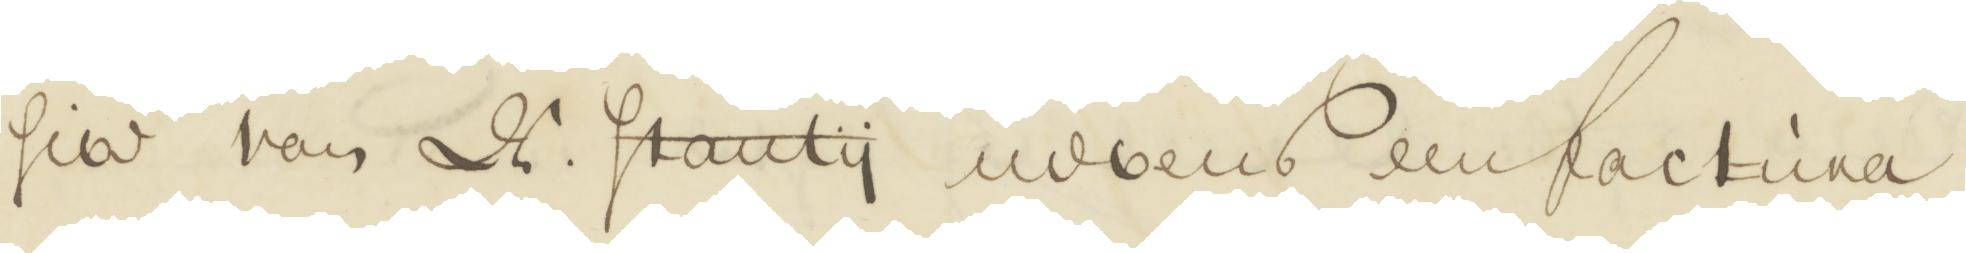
sive van 25. stantij nevens een factura
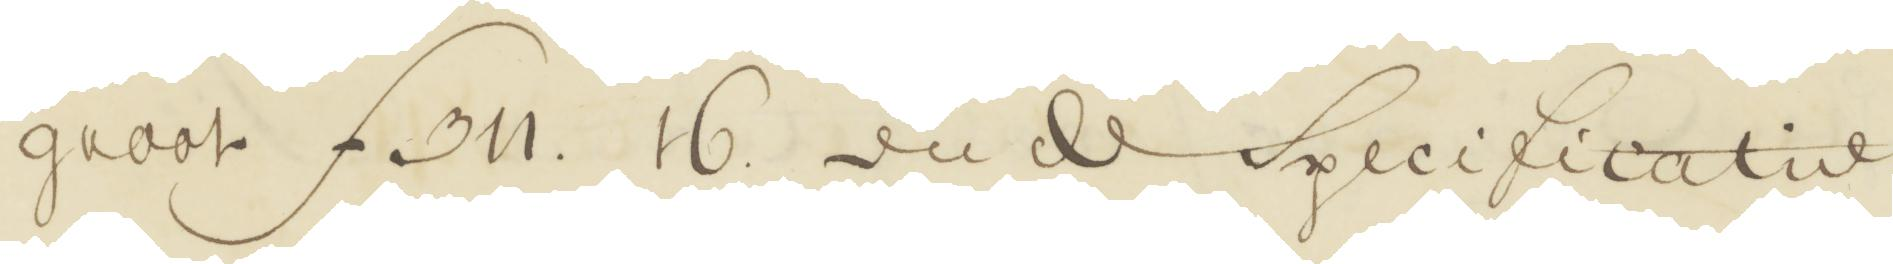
groot ƒ311. 16. en de specificatie
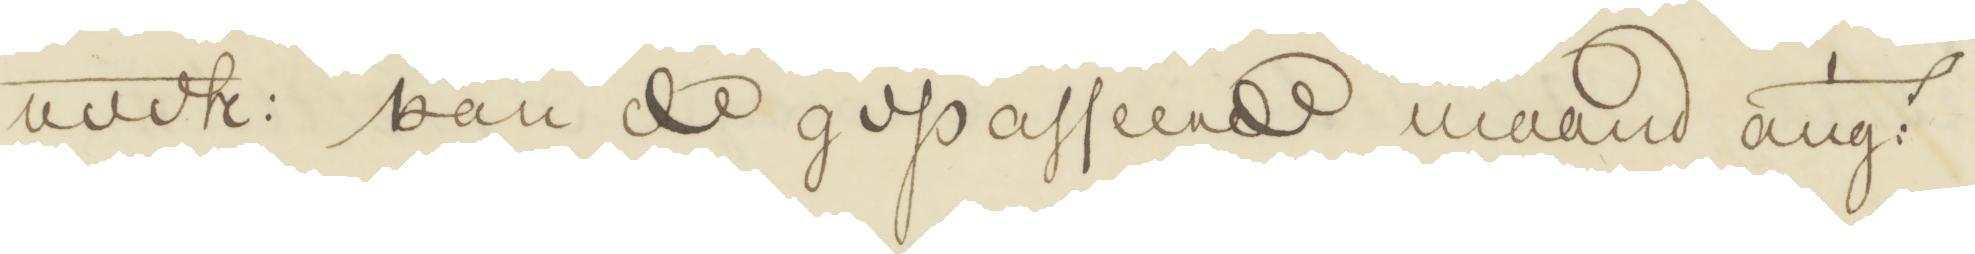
reek: van de gepasseerde maand aug:s
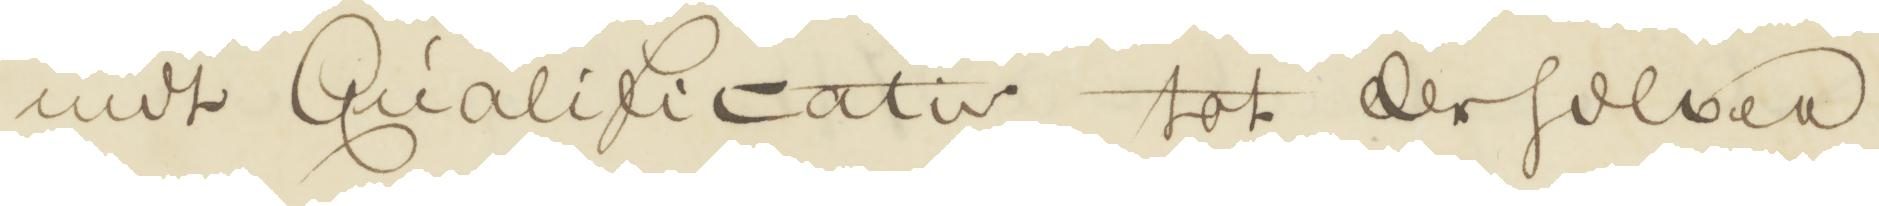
met Qualificatie tot derselver
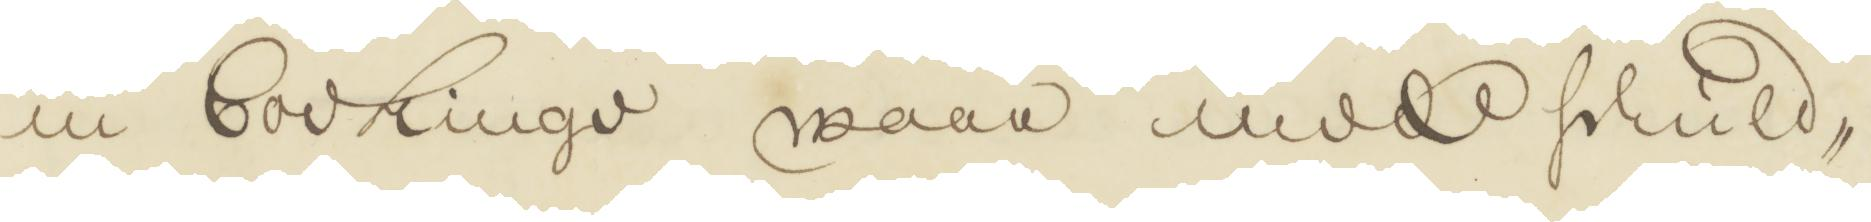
in boekinge waar mede schuld„
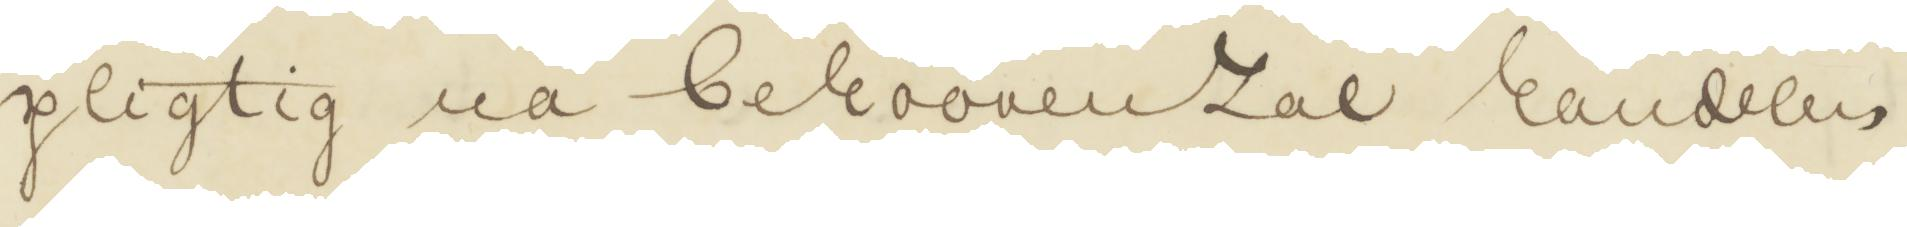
pligtig na behoorenzal handelen
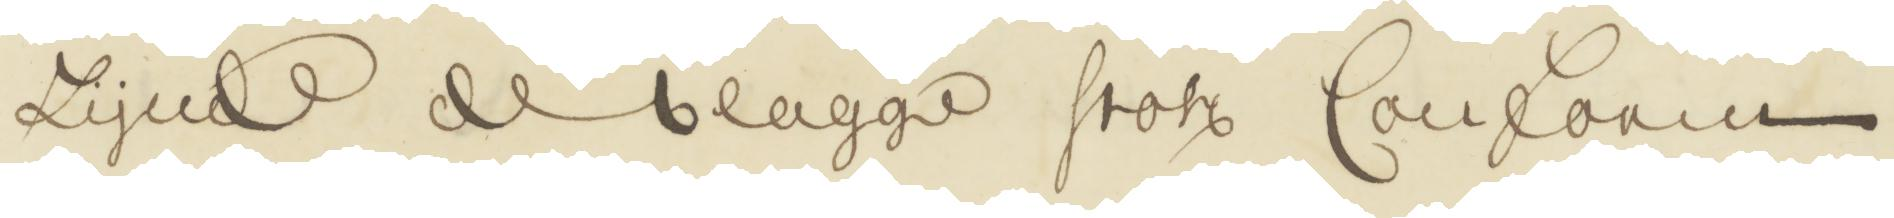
zijnde de vlagge stok Conform
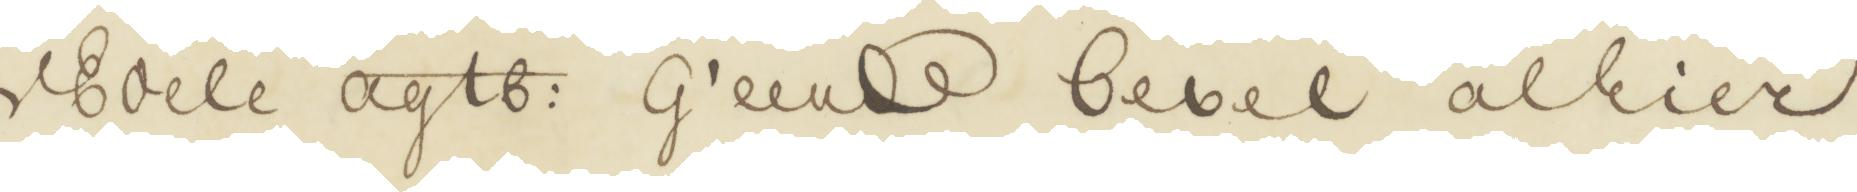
vEdele agtb: g’eerde bevel alhier
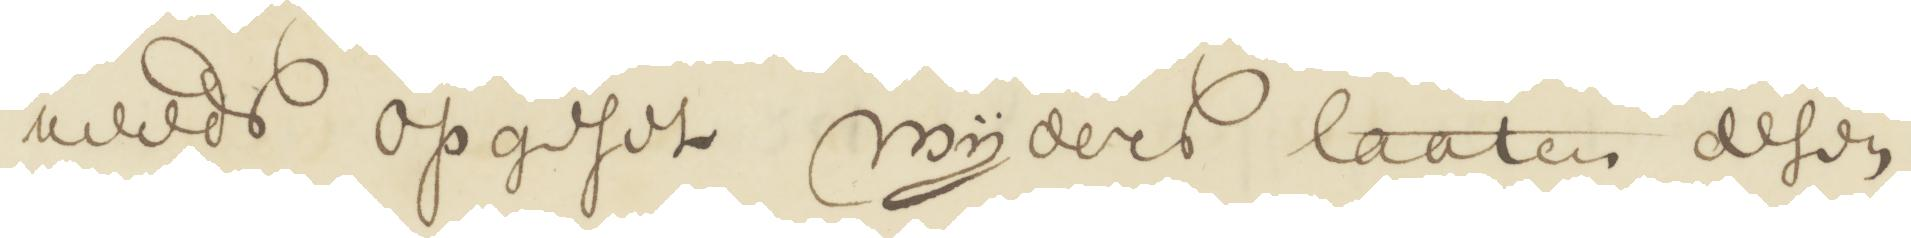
reeds opgeset wijders laaten desen
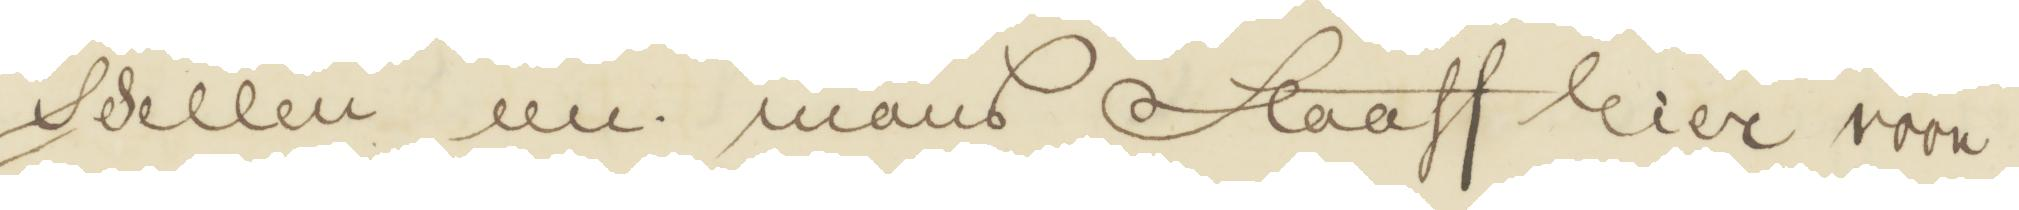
versellen een. mans slaaff hier voor
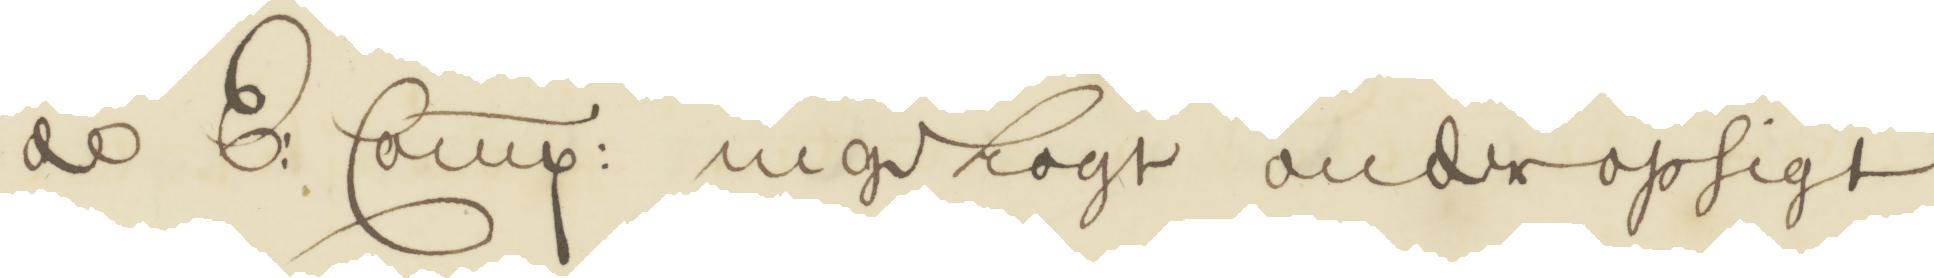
de E: Comp: ingekogt onder opsigt
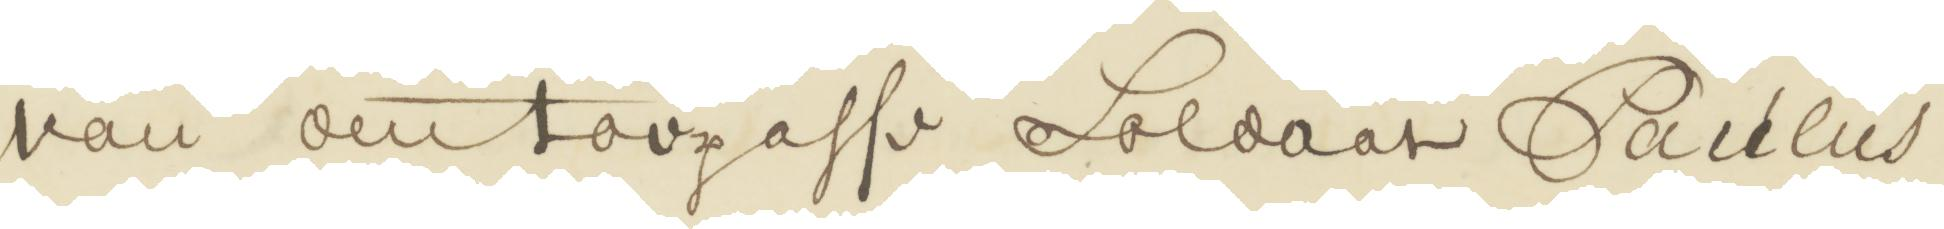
van dentoepasse soldaat Paulus
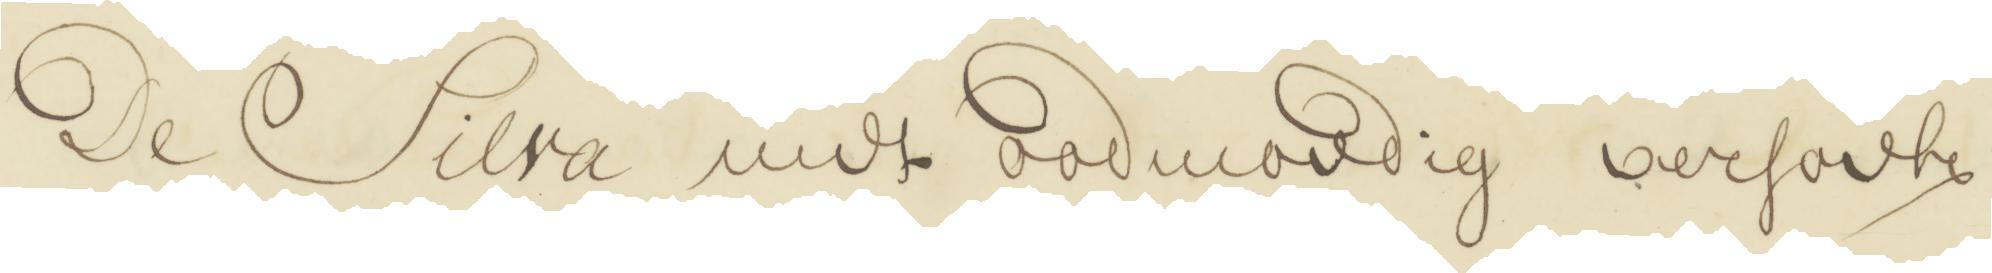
De Silva met oodmoedig versoek
